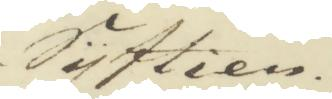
Vijftien.
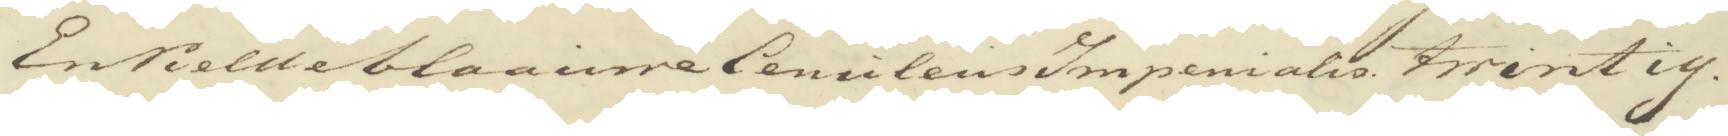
Enkelde blaauwe Cenuleus Imperialis. twintig.
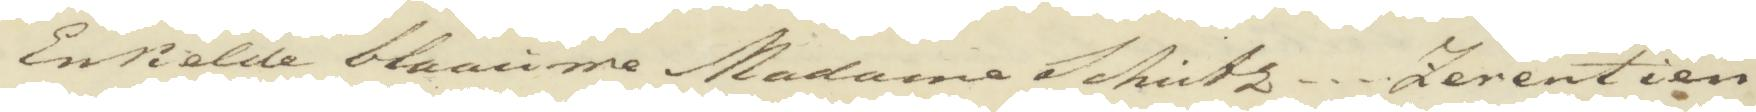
Enkelde blaauwe Madame schutz - - - Zeventien
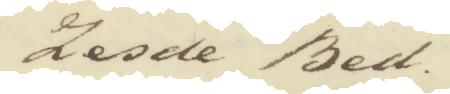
Zesde Bed.
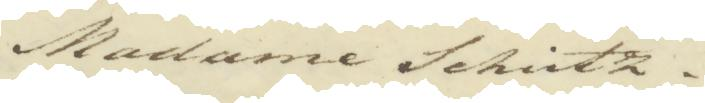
Madame Schutz
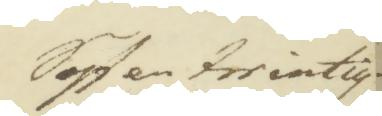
Vyf en twintig
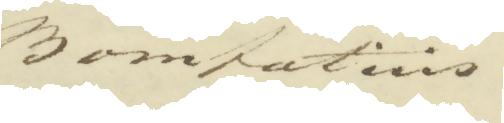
Bonfatius
